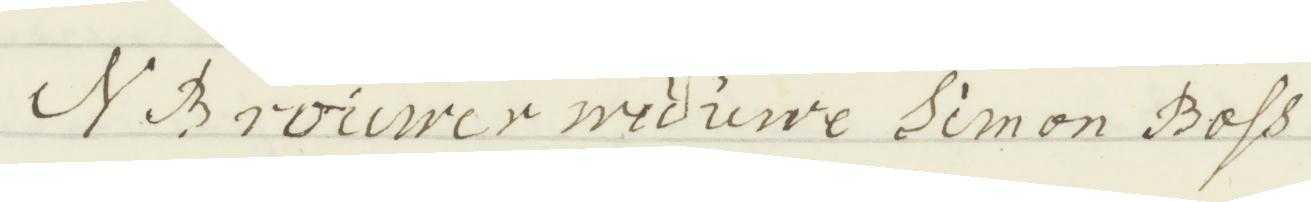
N Brouwer weduwe Simon Boss
